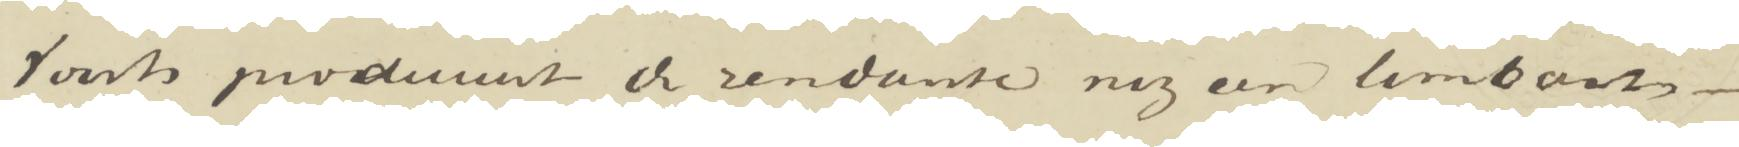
Voorts produceert de rendante nog een lombarts
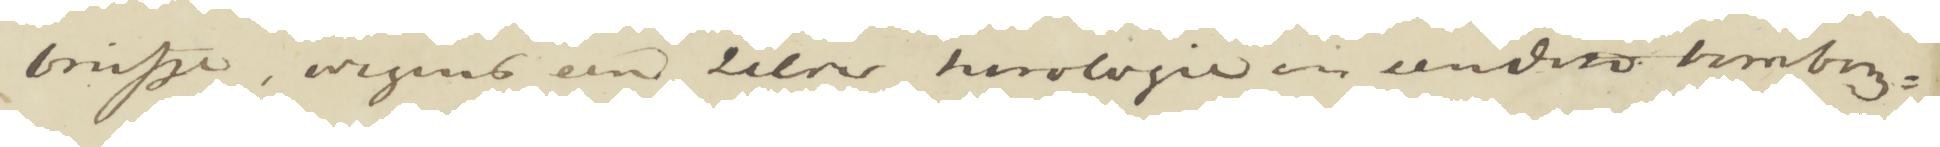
briefje, wegens een zilver horologie en eendito bombon=
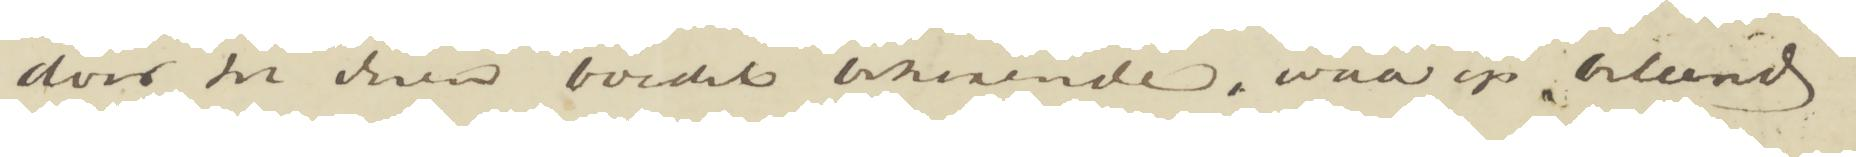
doos, tot dien boedel behorende, waar op beleend
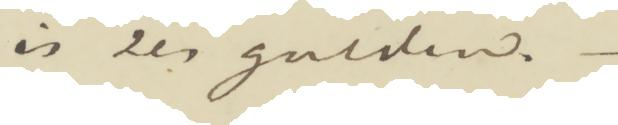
is zes gulden.
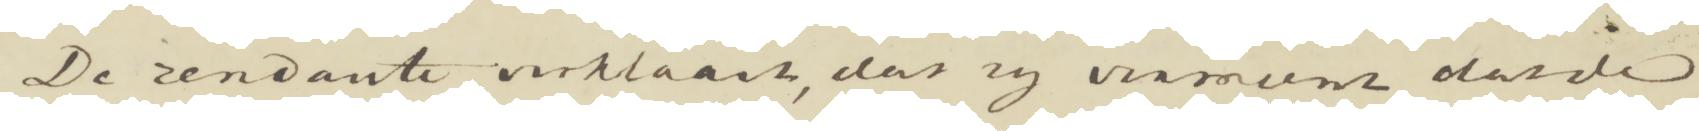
De rendante verklaart, dat zy vermeent, datde
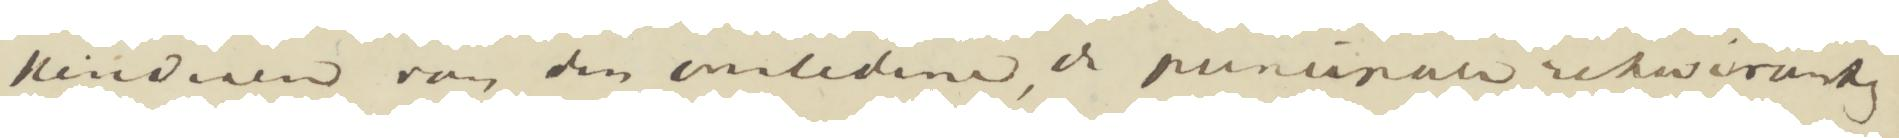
kinderen van den overledene, de principale rekwiranten
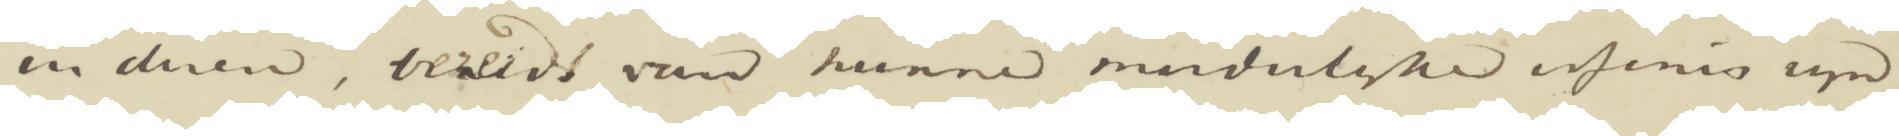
in desen, bereids van hunne moederlyke erfenis zyn
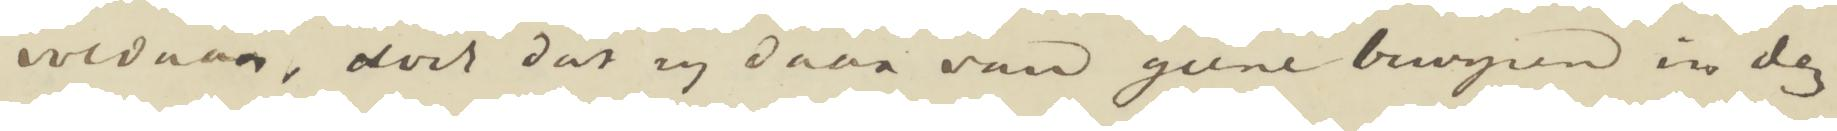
voldaan, doch dat zy daar van geene bewyzen in den
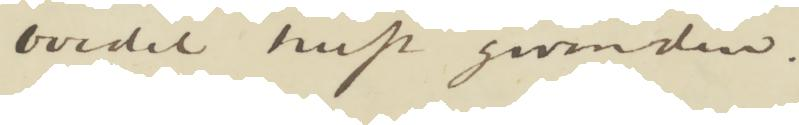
boedel heeft gevonden
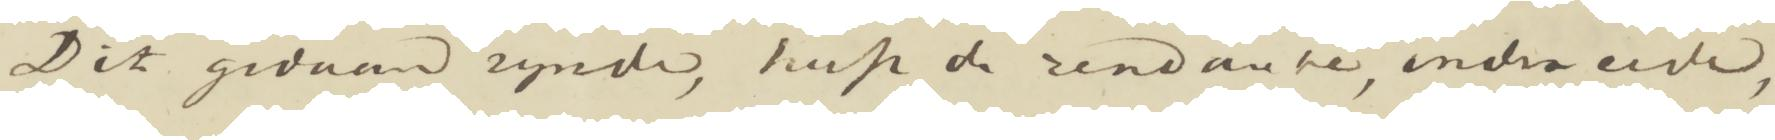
Dit gedaan zynde, heeft de rendante, onder eede,
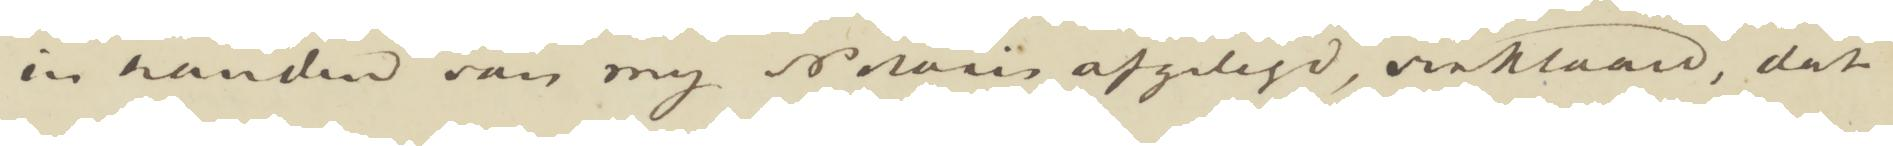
in handen van my Notaris afgelegd, verklaard, dat
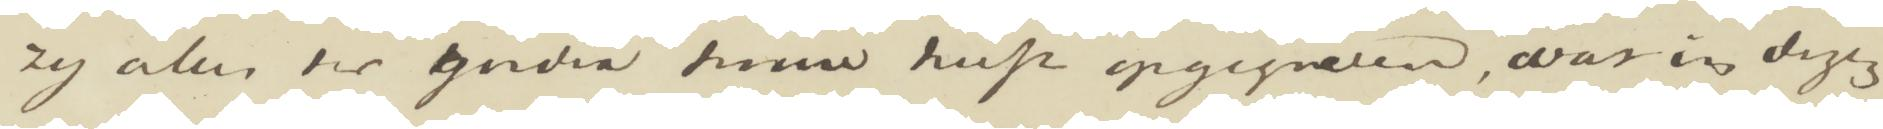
zy alles ter goeder trouw heeft opgegeven, wat in dezen
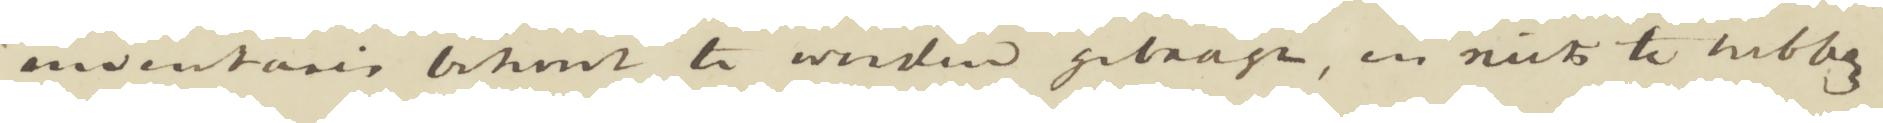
inventaris behoort te werden gebragt, en niets te hebben
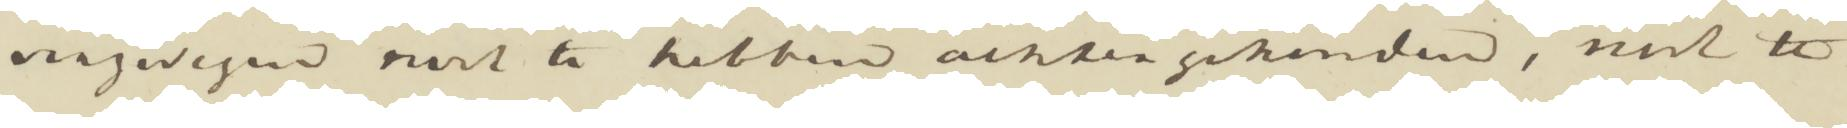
vergevegen noch te hebben achter gehouden, noch te
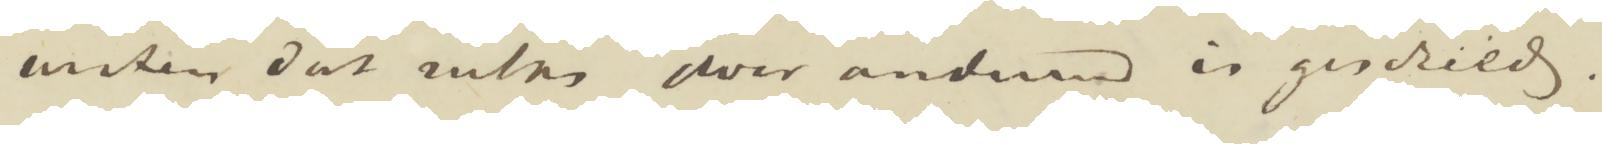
weten dat zulks door anderen is geschied.
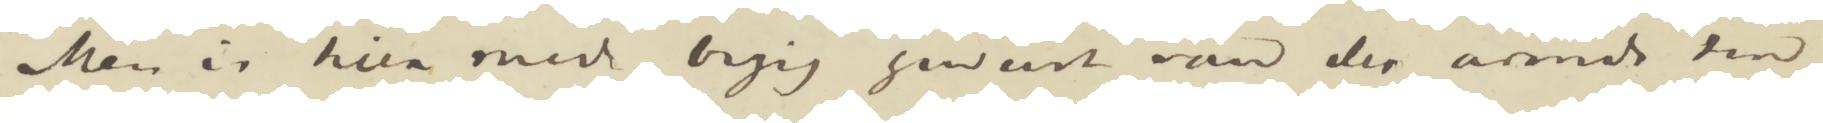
Men is hier mede bezig geweest van des avonds ten
